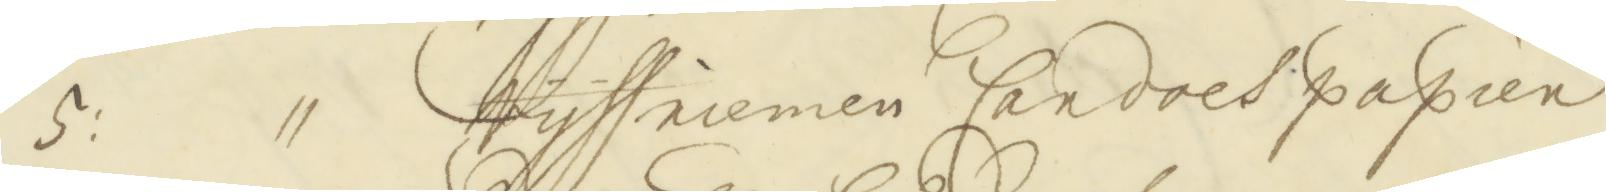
5: „ vijffriemen Cardoes papier
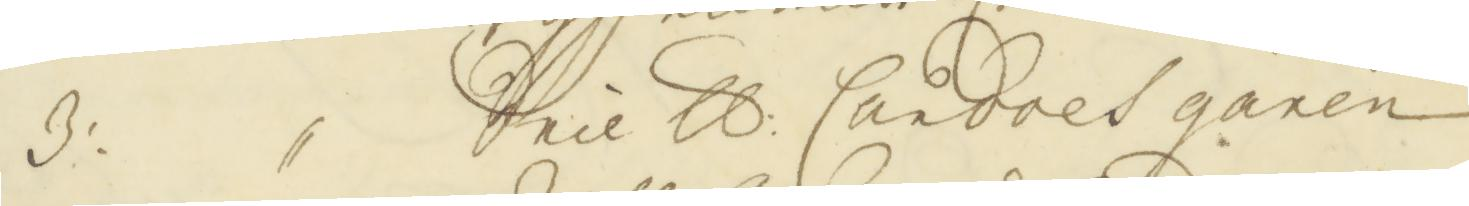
3: „ drie lb: Cardoes garen
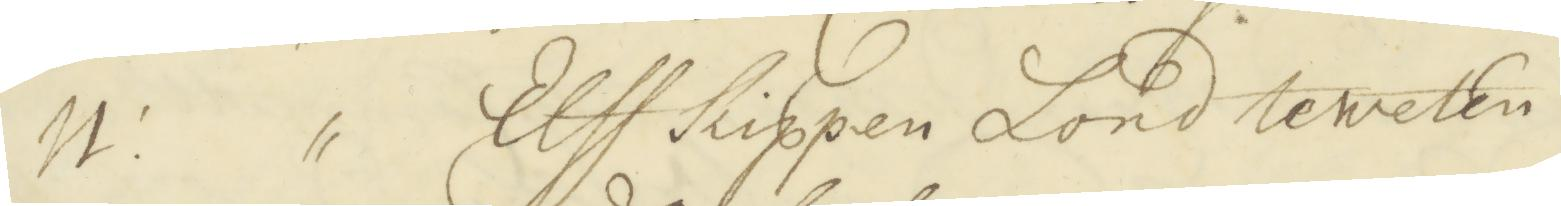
11. „ Elff Kippen Lond te weten
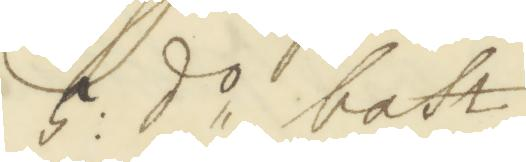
5: d„o bast
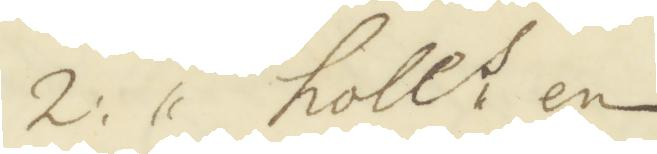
2: „ holl:s en
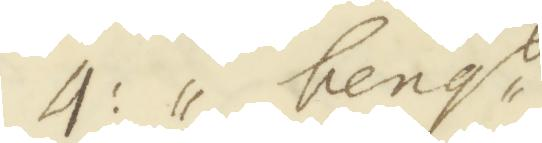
4: „ beng„s
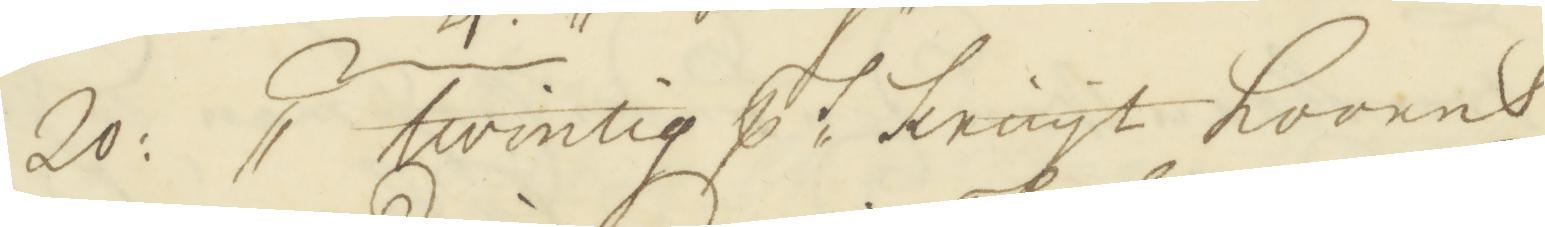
20: „ twintig p„s kruijt hoorns
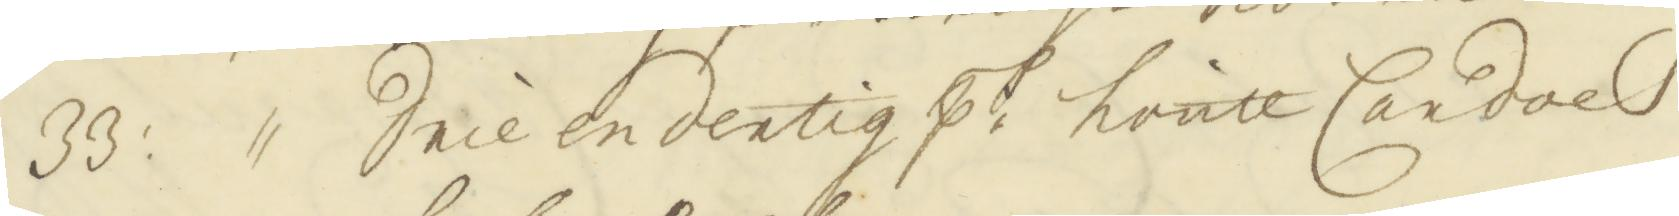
33: „ drie en dertig p„s houte Cardoes
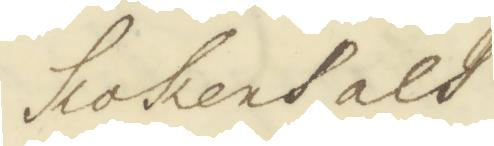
kokers als
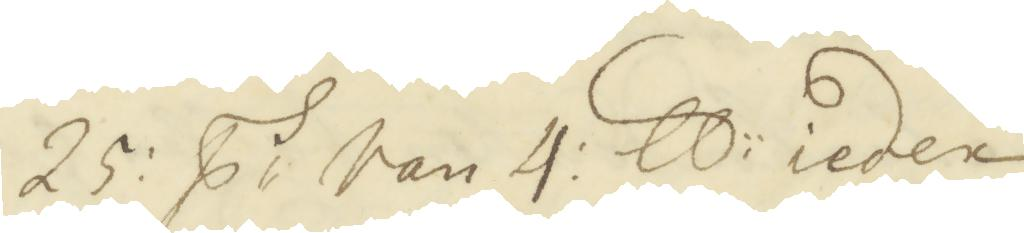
25: p„s van 4: lb: ieder
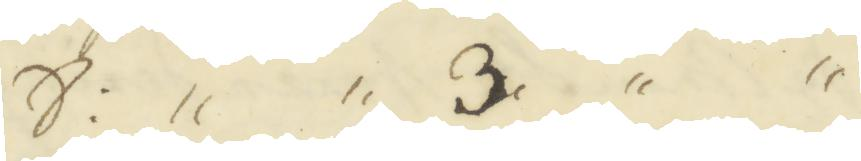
8: „ „ 3, „ „
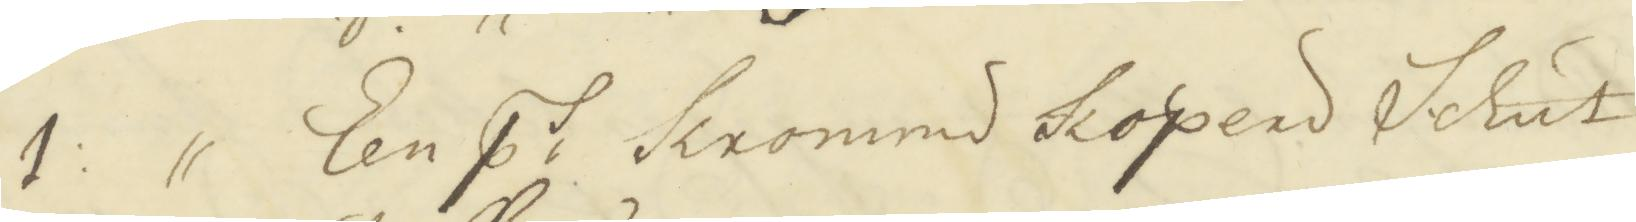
1: „ Een p„s kromme kopere schut
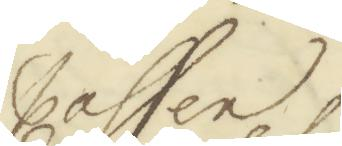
paffer
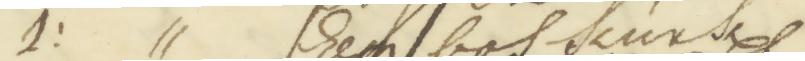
1: „ Een boskurk
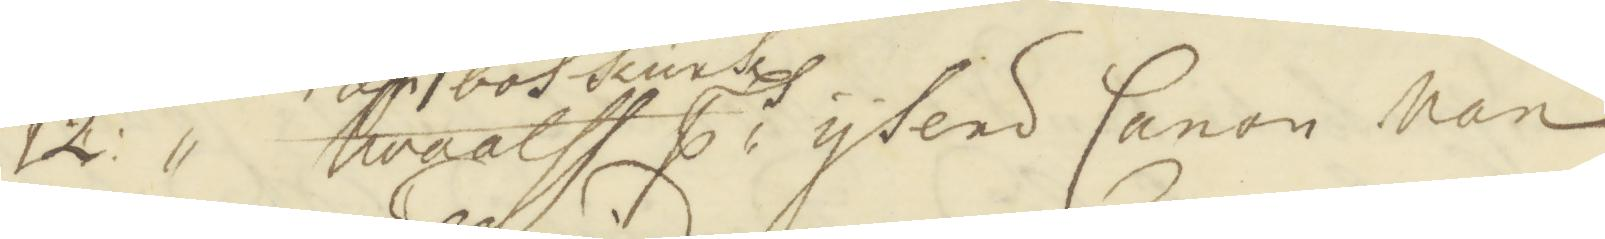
12: „ twaalff p„s ijsers Canon van
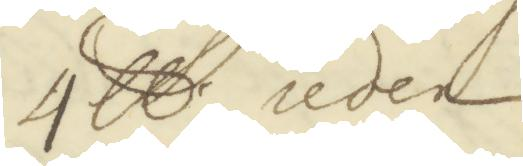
4 lb: ieder
